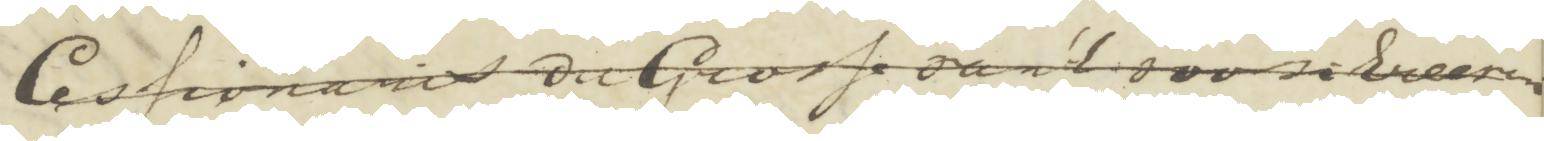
Cessionaris die Grosse van 't voorschreeven
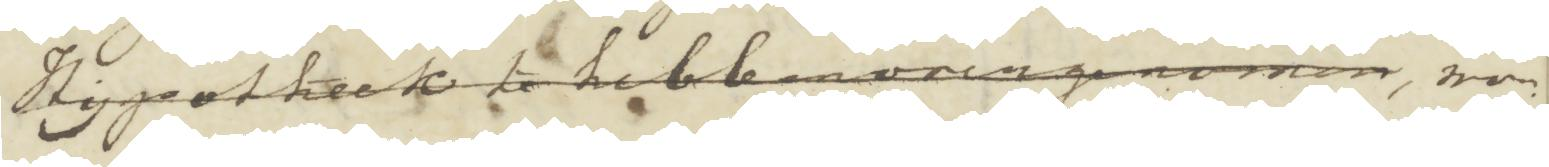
Hypotheek te hebben voor genomen, wor
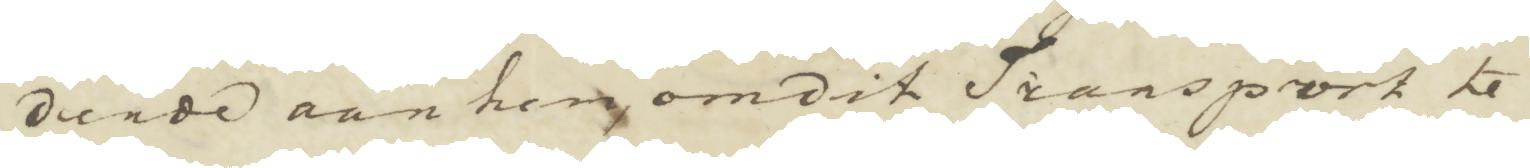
dende aan hem om dit Transport te
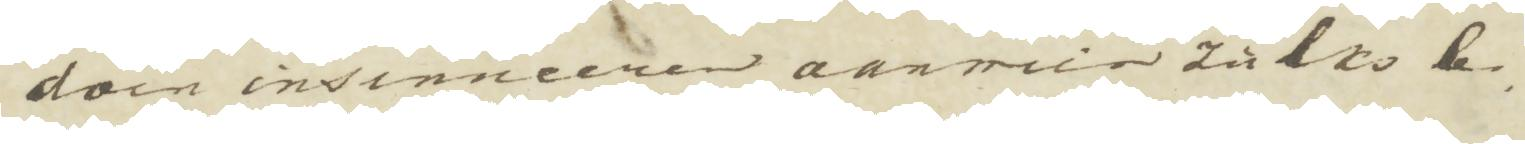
doen insinueeren aan wien zulxs be
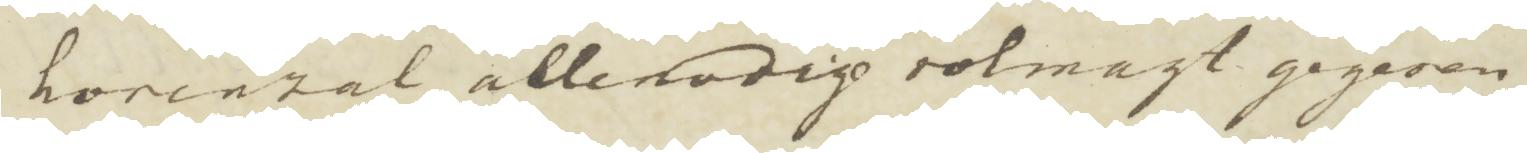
horen zal, alle nodige volmagt gegeven
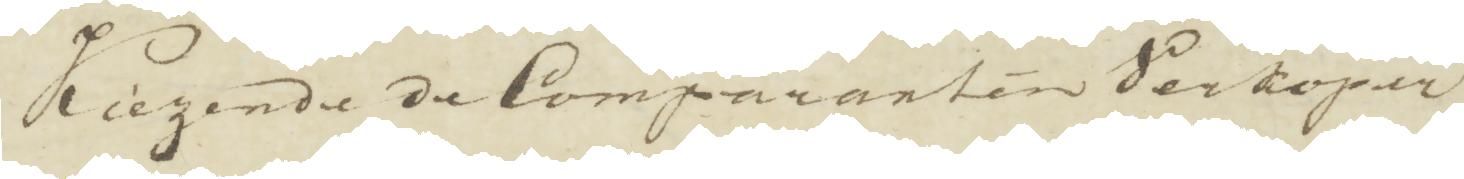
Kiezende de Comparanten Verkoper
